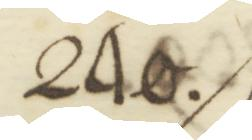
240.
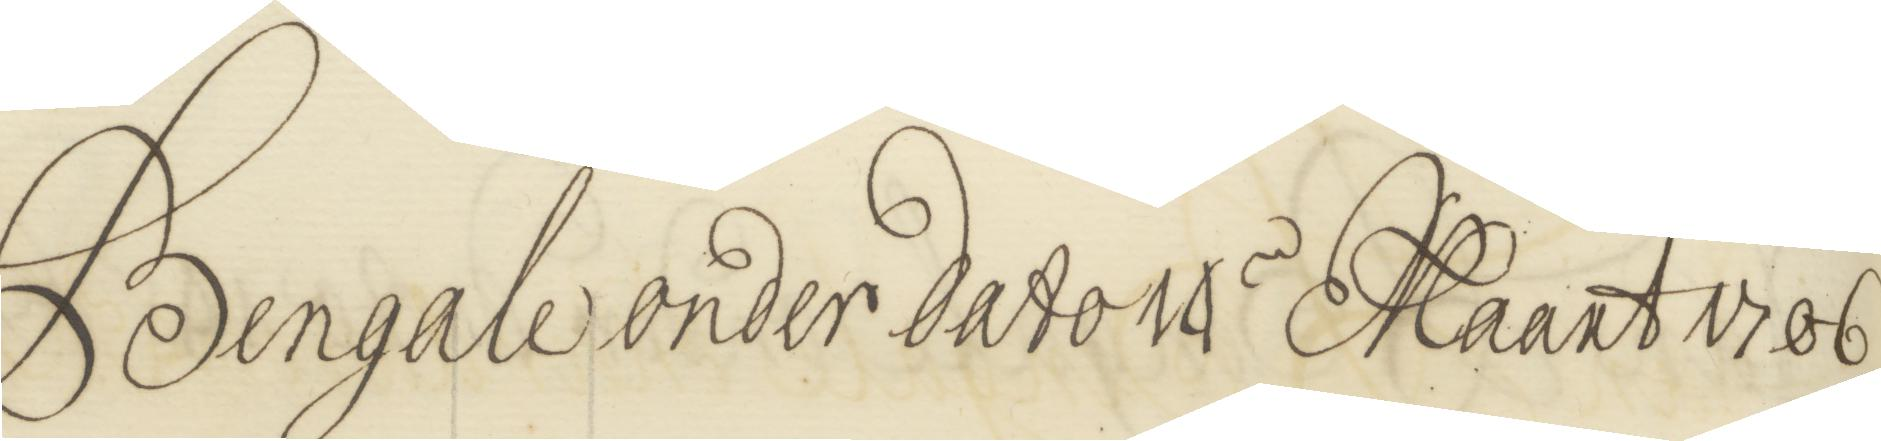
Bengale onder dato 14:' Maart 1706.
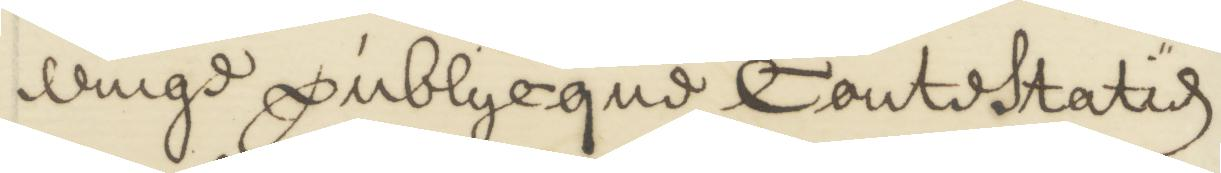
eenige publycque Contestatiën
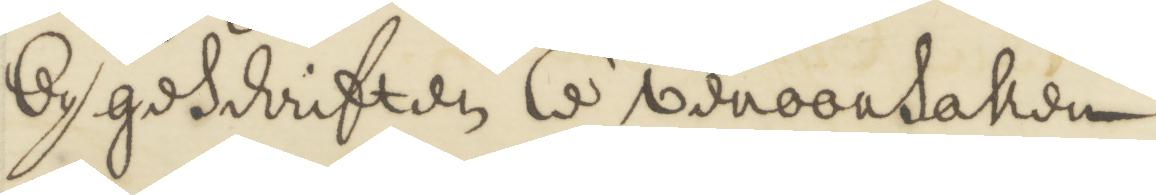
by geschriften te veroorsaken
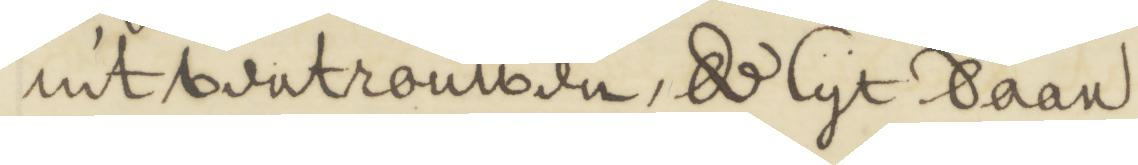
in’t vertrouwen, de tijt daar
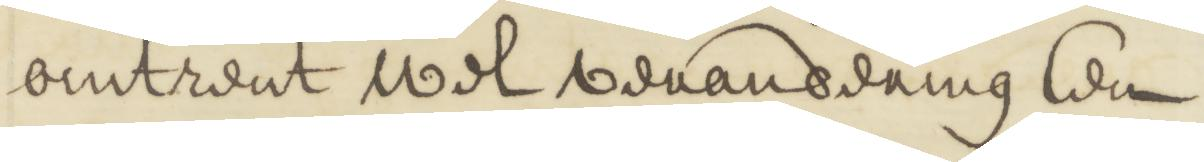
omtrent wel verandering ten
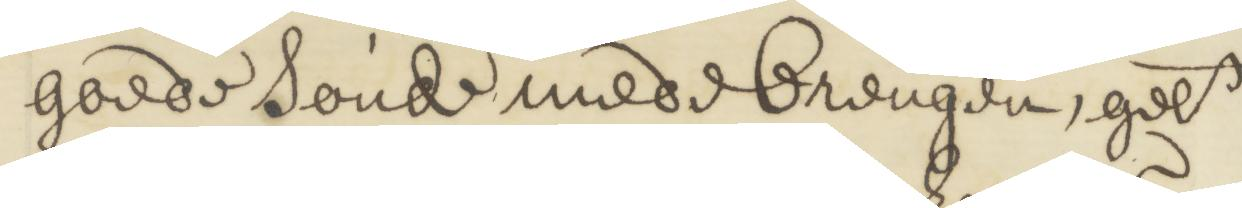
goede soude mede brengen, gelijk
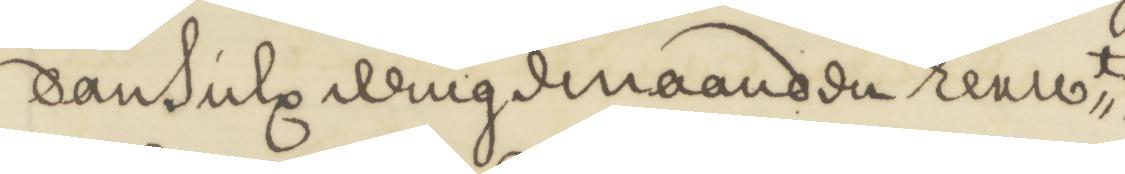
dan sulx eenige maanden herw„.ts
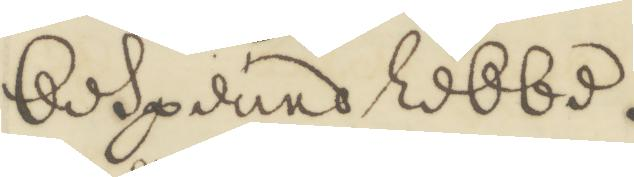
bespeurd hebbe.
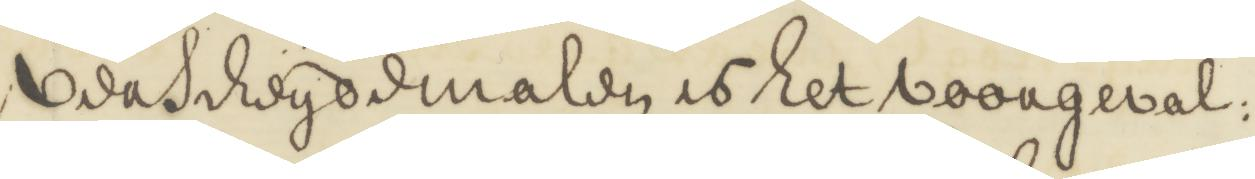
Verscheydemalen is het voorgeval:
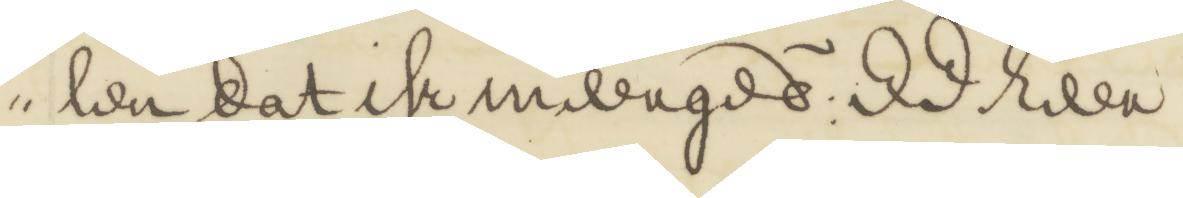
„len dat ik meerged:' EE: heer
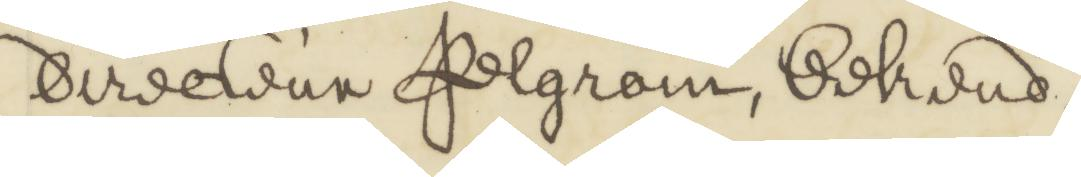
directeur Pelgrom, bekend
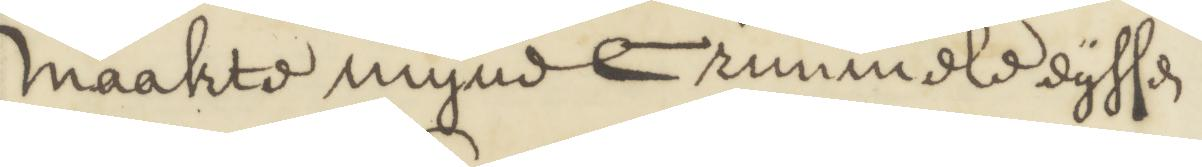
maakte mijne Criminele eijssen
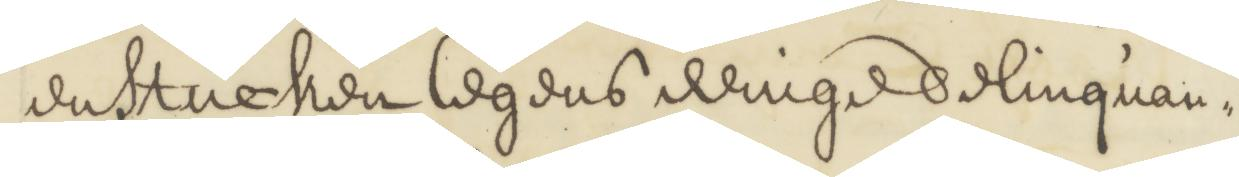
en stucken tegens eenige delinquan„
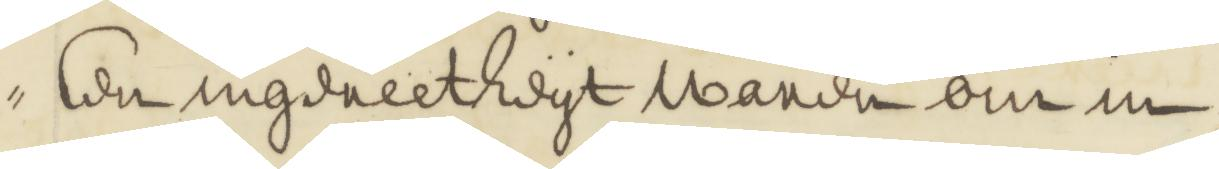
„ ten ingereetheijt waren om in
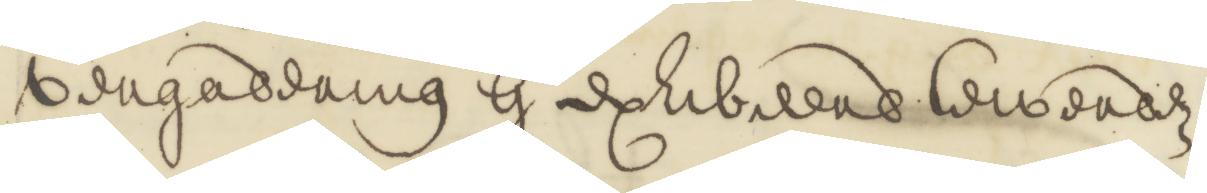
vergadering g’exhibeerd te werden
